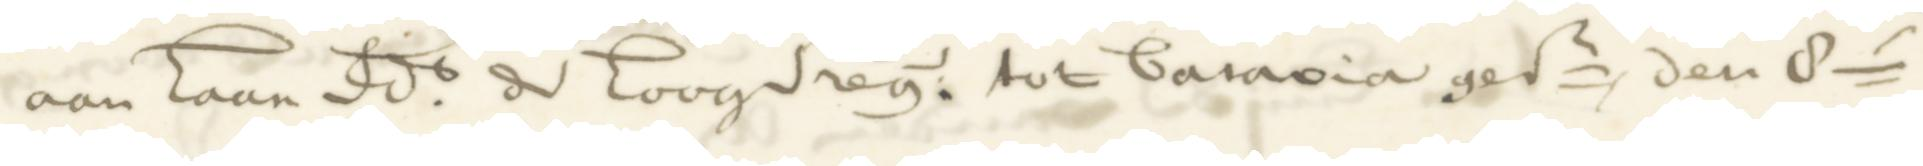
aan haar Ed.s de hooge reg:' tot batavia ges=', den 8='
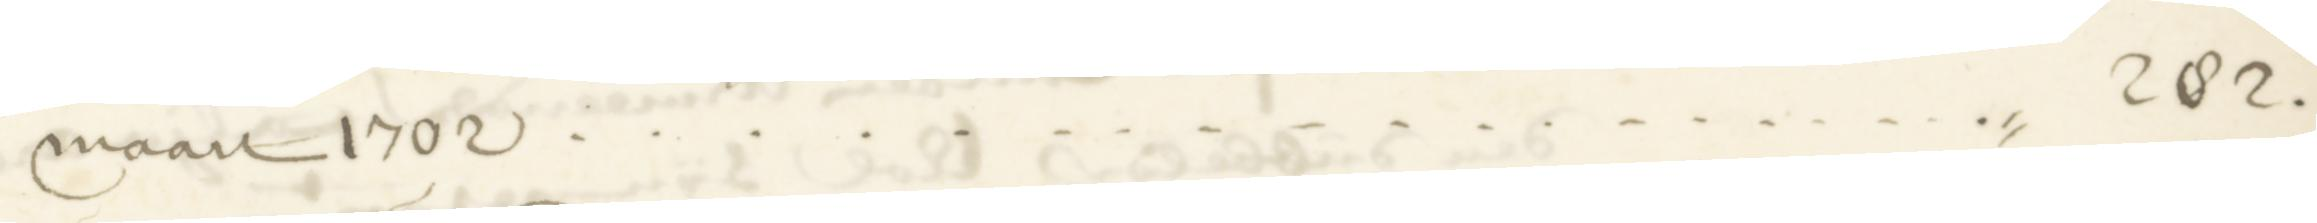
maart 1702 . . . . . . . . . . . . . . . . . . . „ 282.
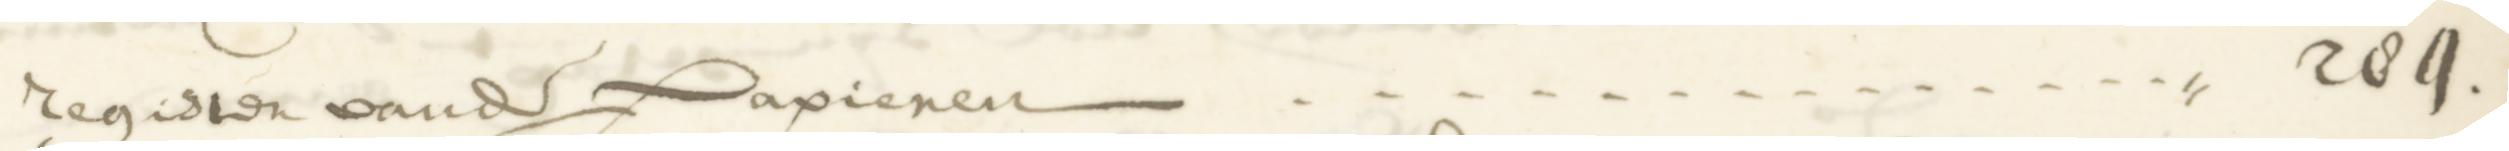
register van de Papieren . . . . . . . . . . . . . . „ 284.
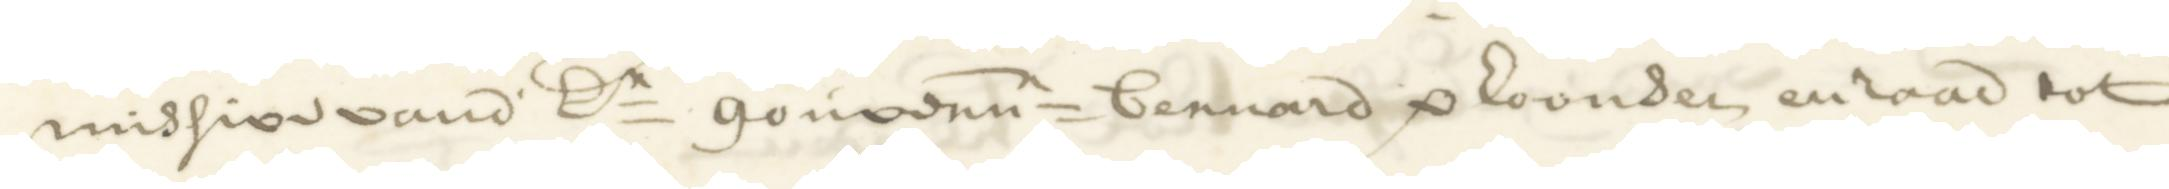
missive vand' H=r gouvern=r bernard phoonsen en raad tot
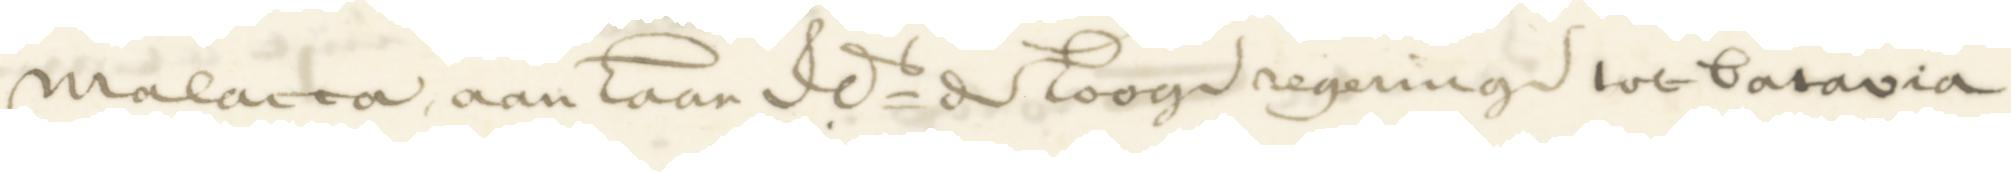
Malacca, aan haar Ed=s de hooge regeringe tot batavia
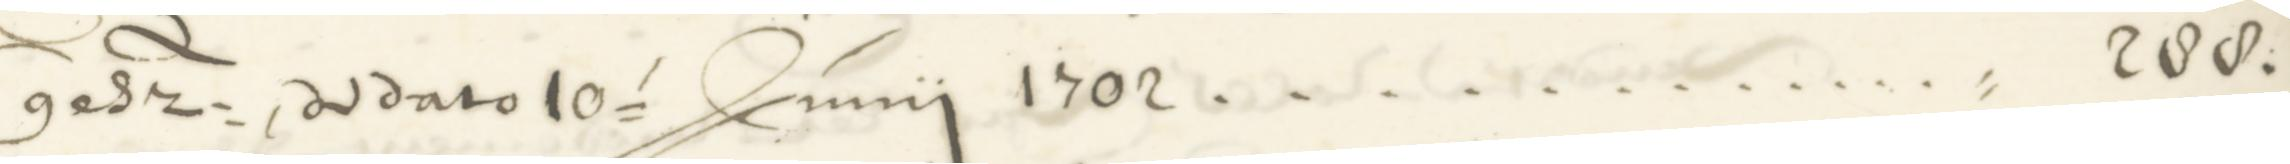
gesz=, de dato 10=' Junij 1702. . . . . . . . . . . . „ 288.
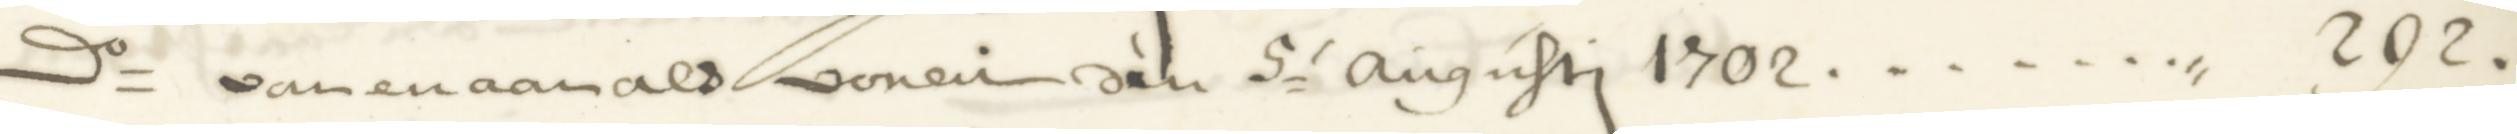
D=o van en aan als voren den 5=' augustj 1702. . . . . . .„ 292.
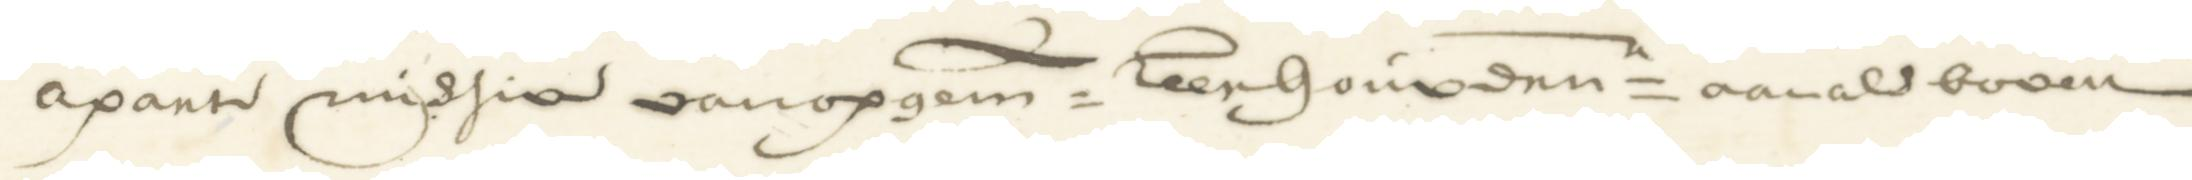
aparte missive van opgem= heer gouvern=r aan als boven
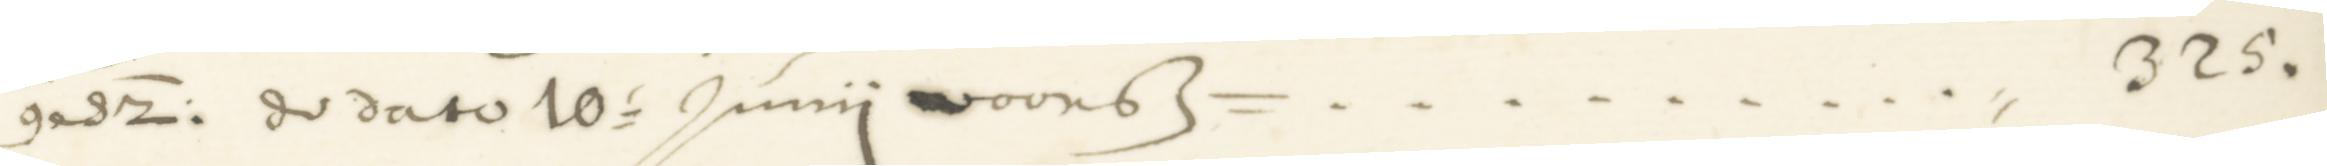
gesz: de dato 10=' Junij voors= . . . . . . . . . „ 325.
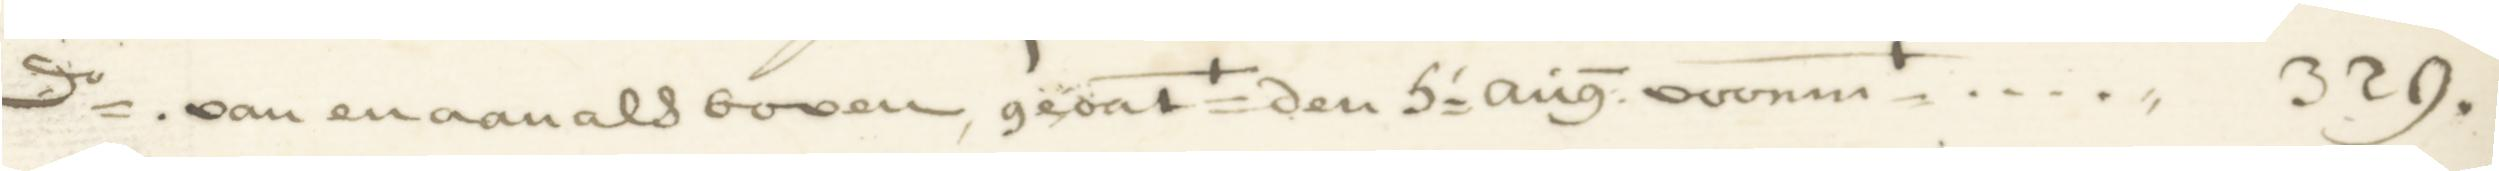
D=o. van en aan als boven, gedat=t den 5=' aug: voorm=t . . . . „ 329.
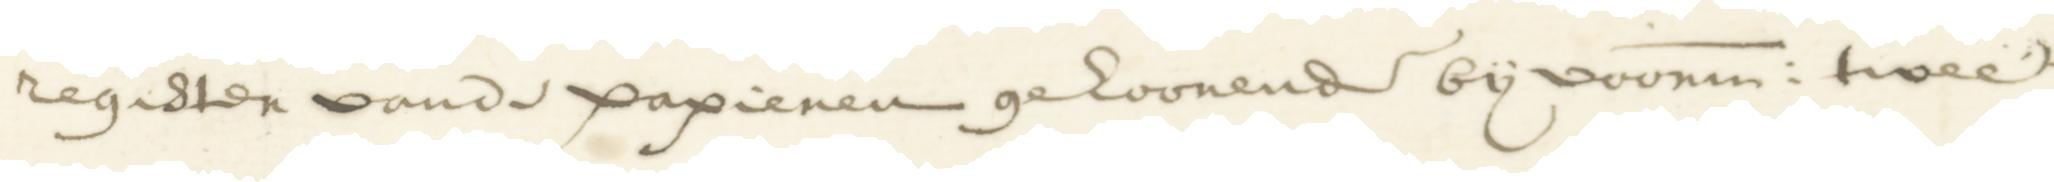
register van de papieren gehoorende bij voorm: twee
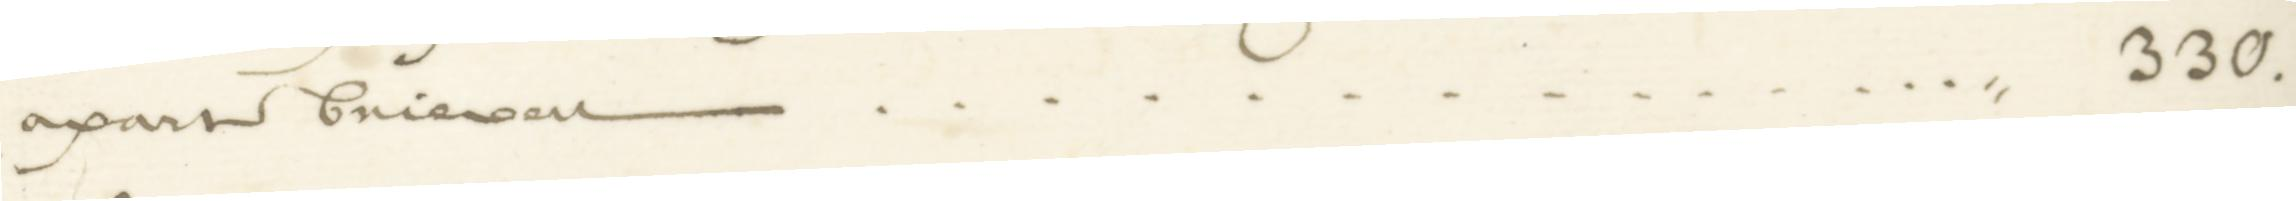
aparte brieven . . . . . . . . . . . . . . „ 330.
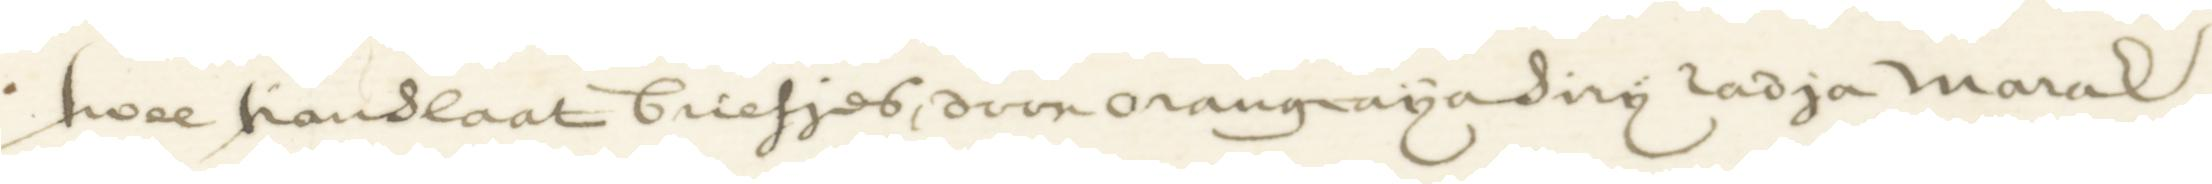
twee translaat briefjes, door orangcaijasirij radja marah
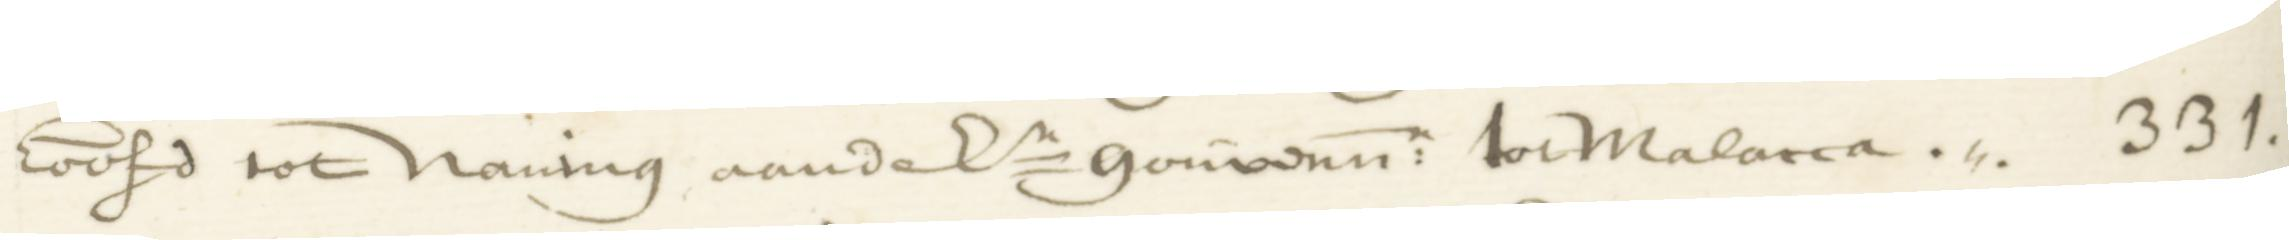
hoofd tot Naning aan de E=n gouvern:r tot Malacca.„. 331.
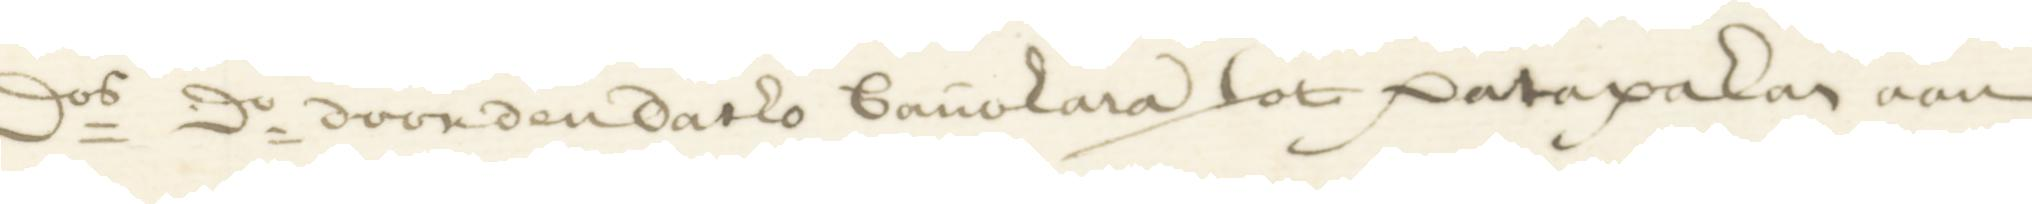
D=os D=o door den datho bandhara tot patapahan aan
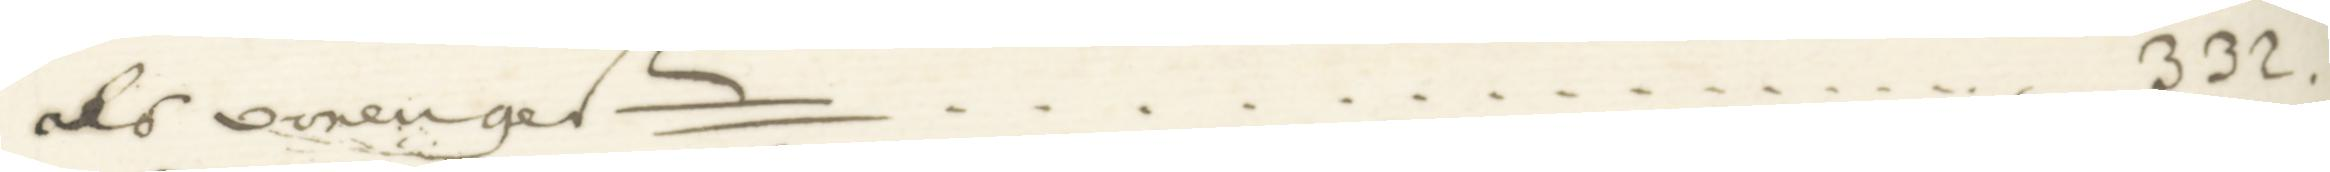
als voren ges=' . . . . . . . . . . . . . . . „ 332.
